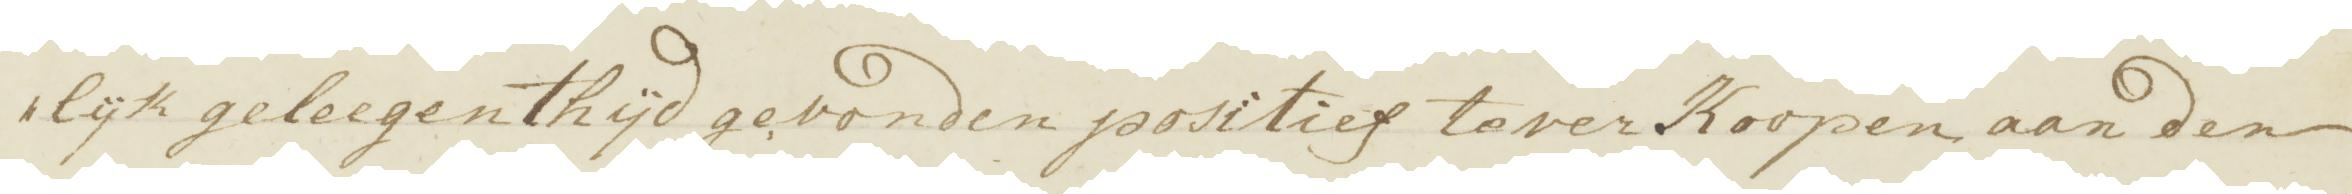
„lijk geleegenthijd gevonden positief te verkoopen aan den
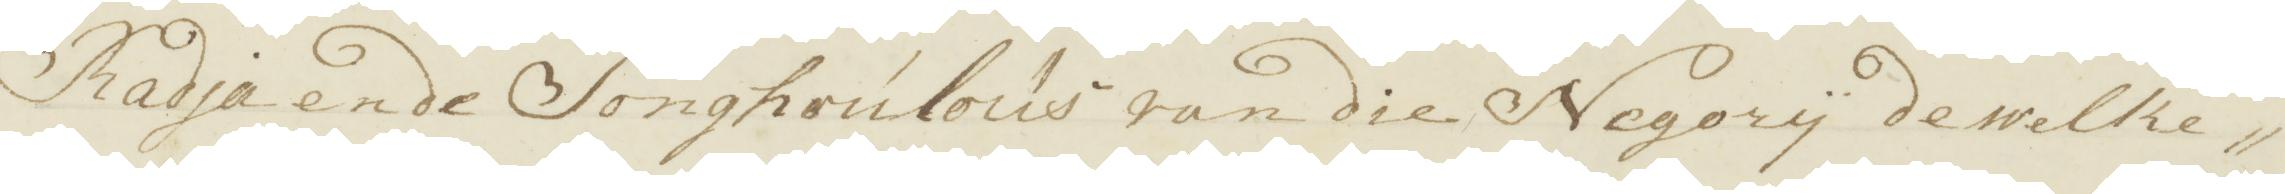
Radja ende Ponghoulous van die Negorij dewelke„
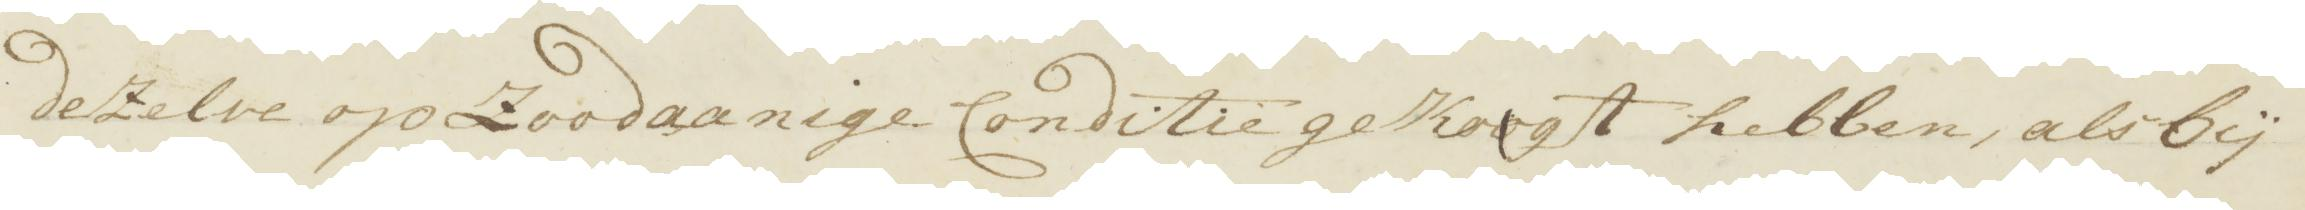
dezelve op zoodaanige conditie gekogt hebben, als bij
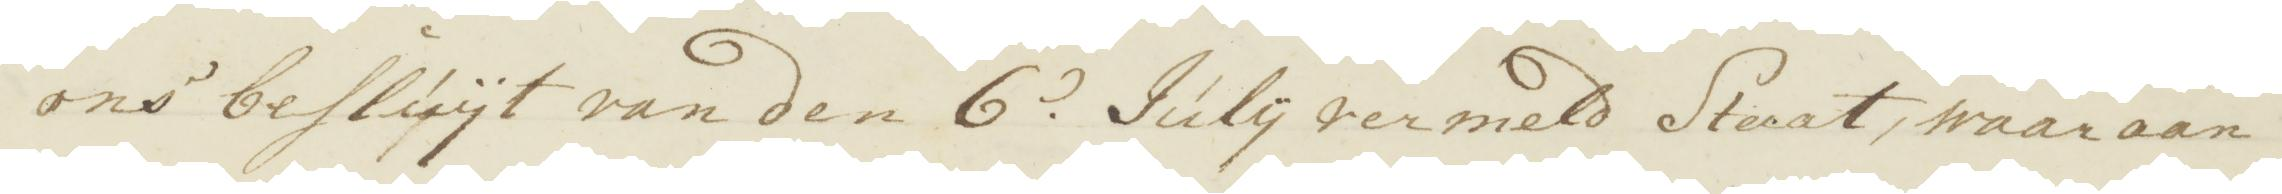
ons' besluijt van den 6.' Julij vermeld staat, waaraan
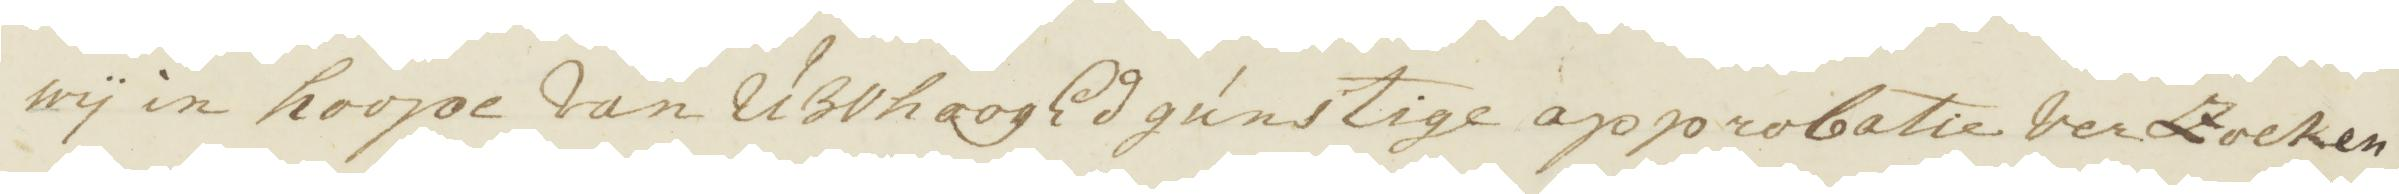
wij in hoope van uw hoogEd gunstige approbatie verzoeken
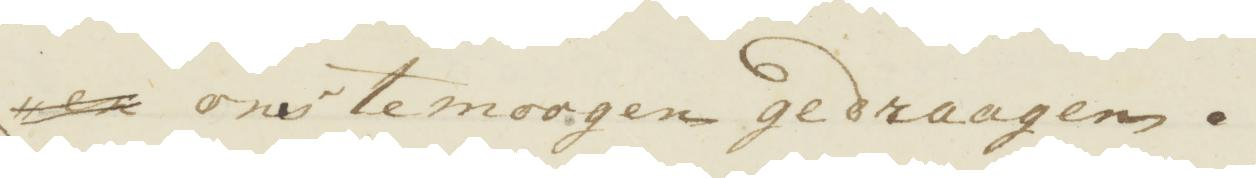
„er ons te moogen gedraagen.
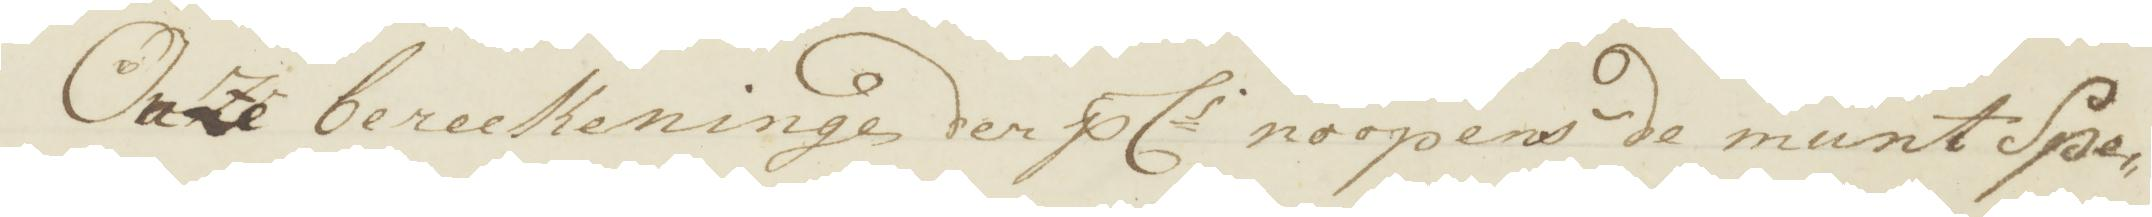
Onze bereekeninge der pc=s noopens de munt spe„
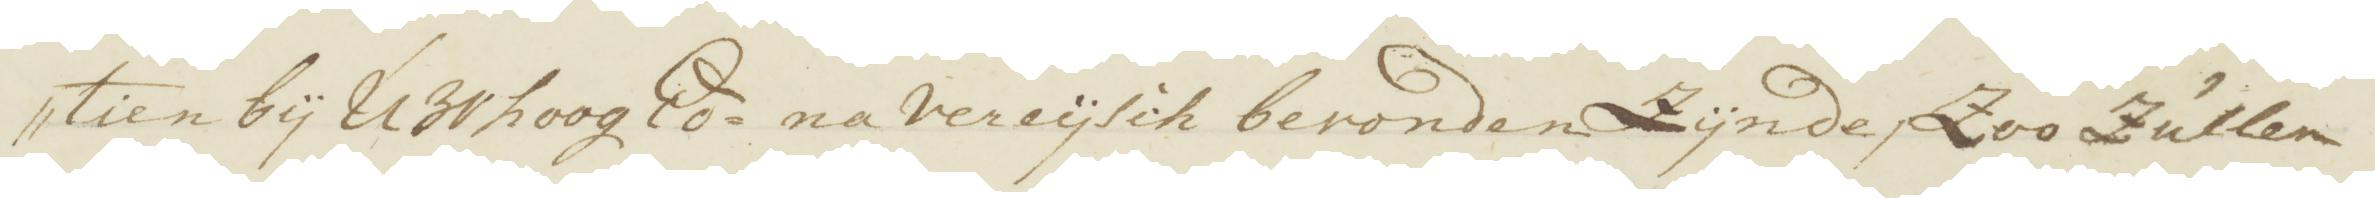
„tien bij Uw hoog Ed= na vereijsch bevonden zijnde, zoo zullen
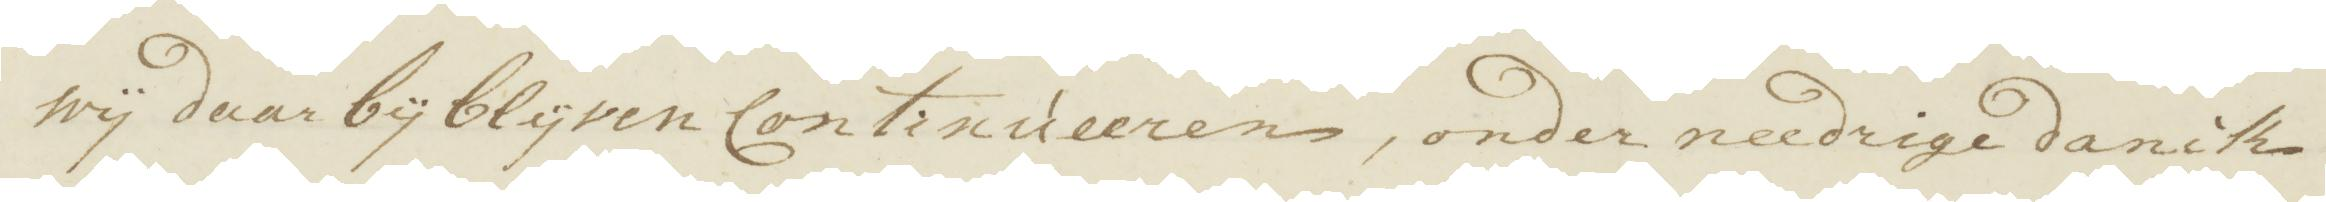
wij daar bij blijven continueeren, onder needrige danck
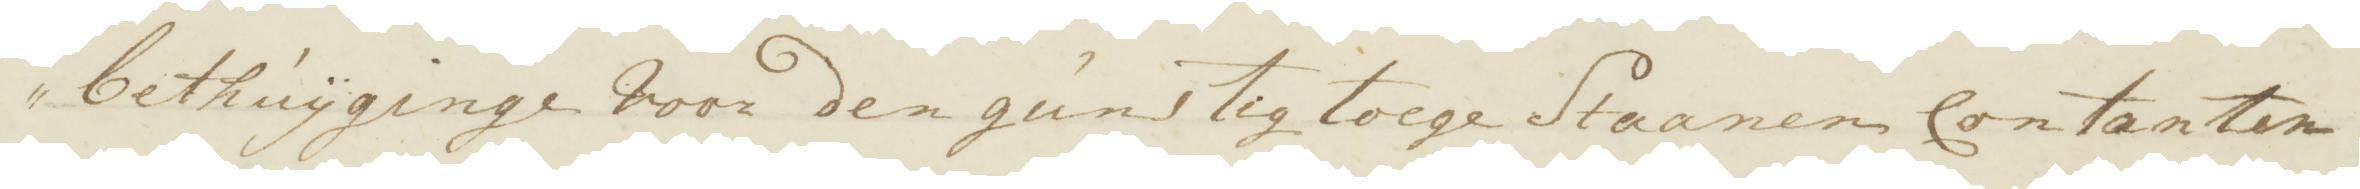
„bethuijginge voor den gunstig toege staanen contanten
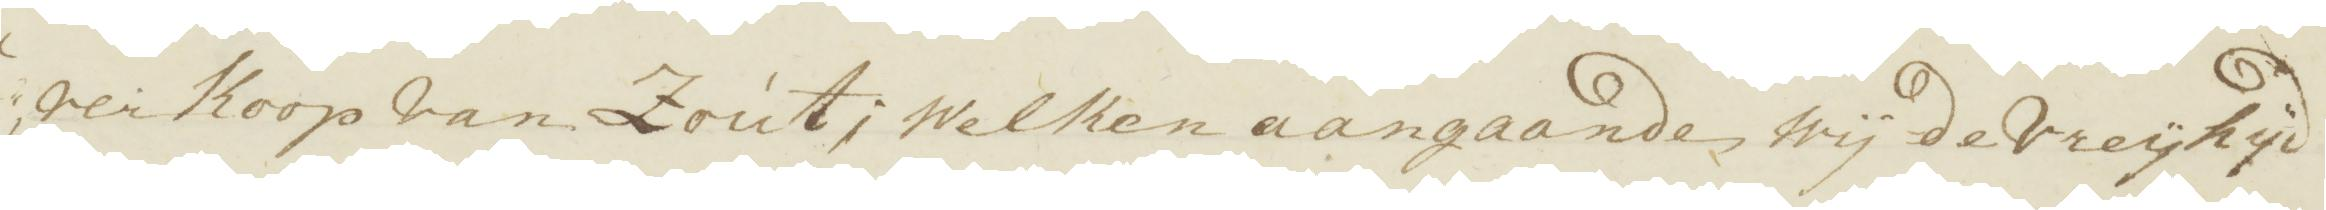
verkoop van zout; welken aangaande wij de vreijhijd
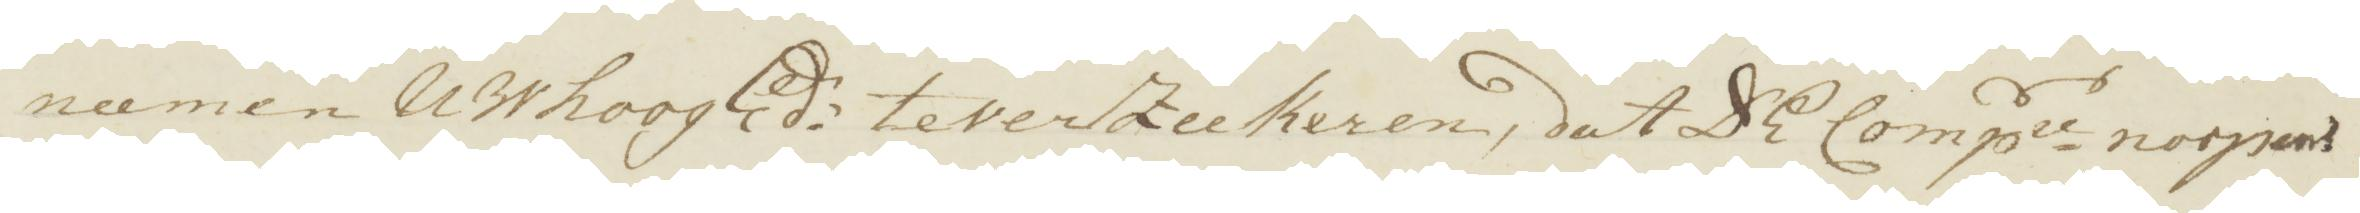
neemen Uw hoog Ed: te verzeekeren, dat DE Comp=ie noopen
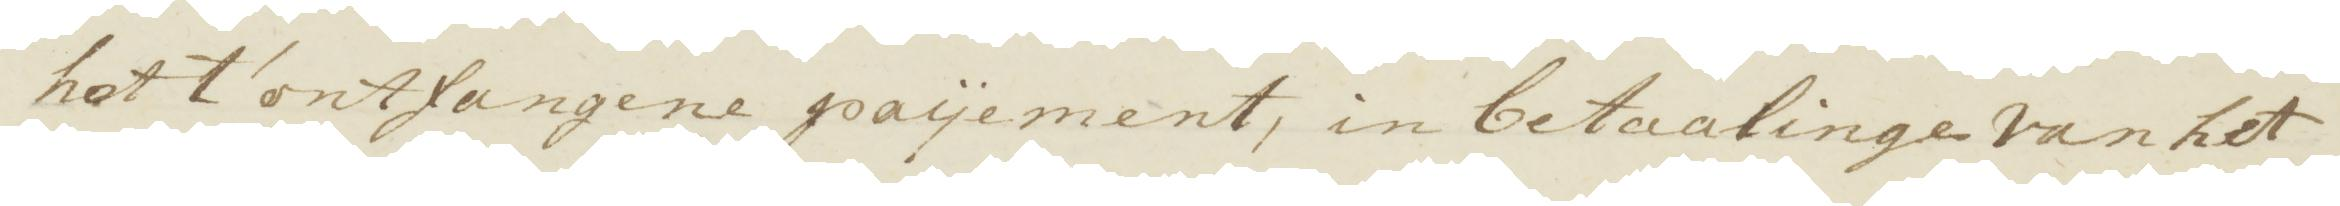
het t'ontfangene paijement, in betaalinge van het
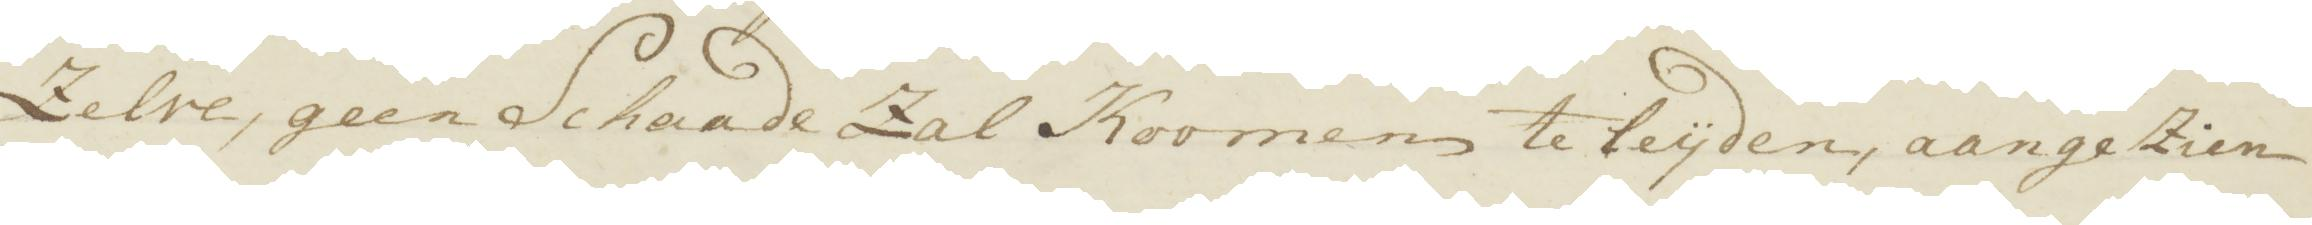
zelve, geen Schaade zal koomen te leijden, aangezien
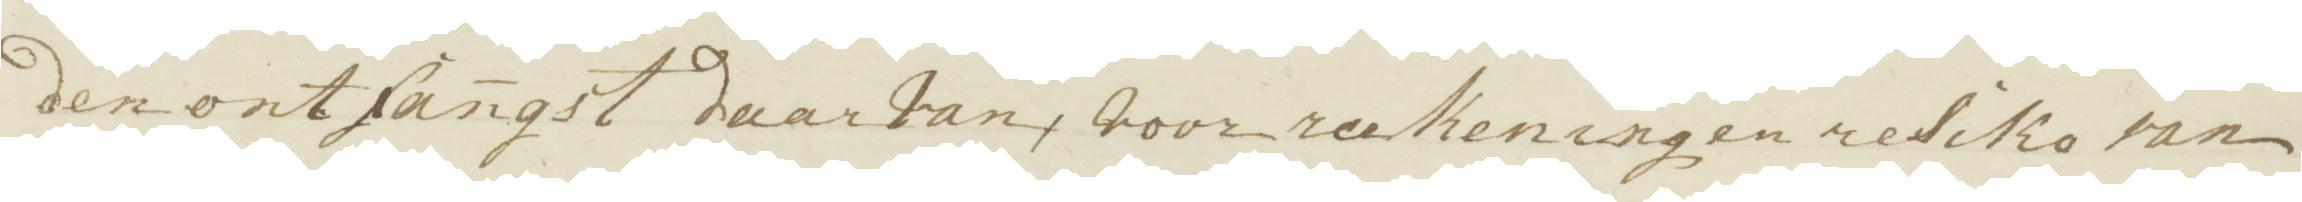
den ontfangst daarvan, voor reekening en resiko van
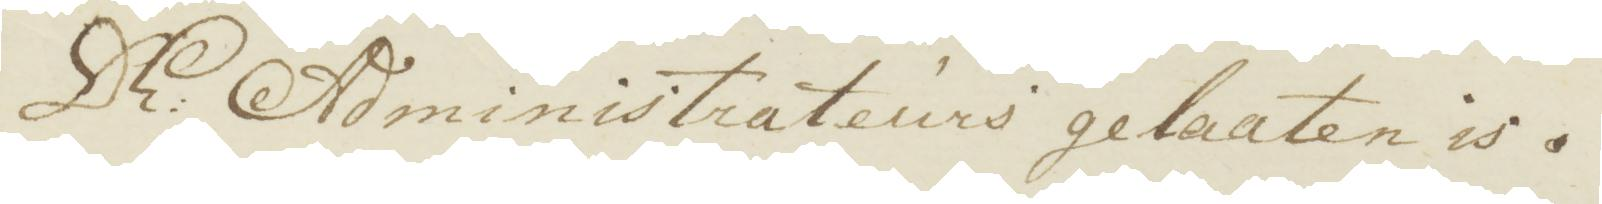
DE: Administrateurs gelaaten is.
